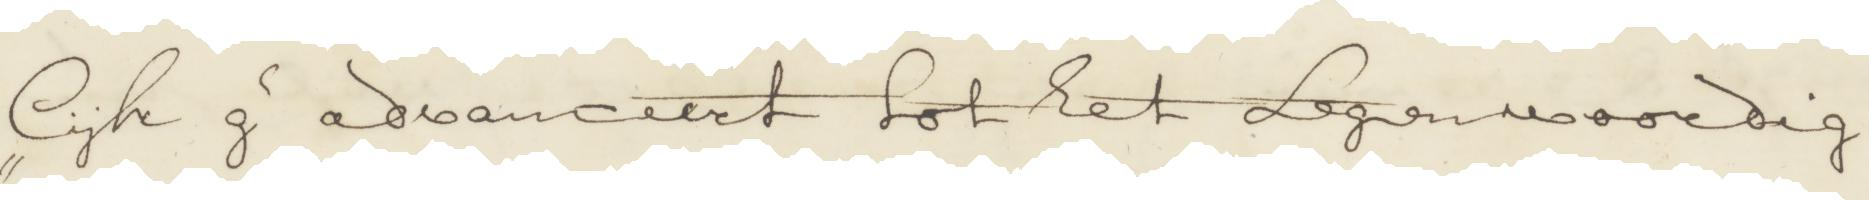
„lijk g’advanceert tot het tegenwoordig
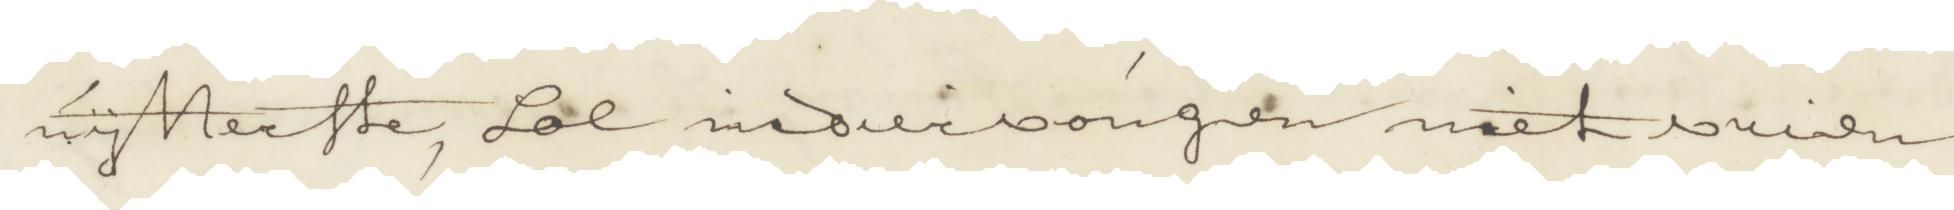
uijtterste, sal indiervougen niet vrien
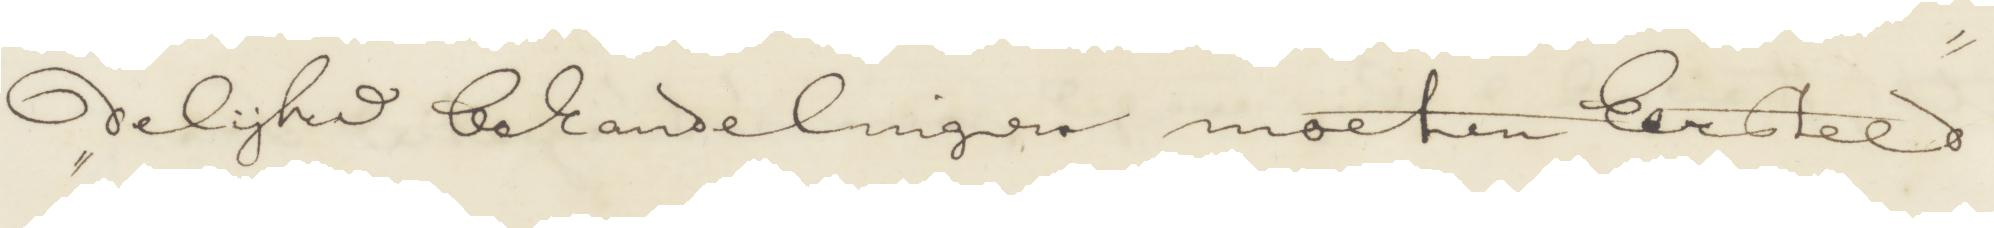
„delijke behandelingen moeten hersteld
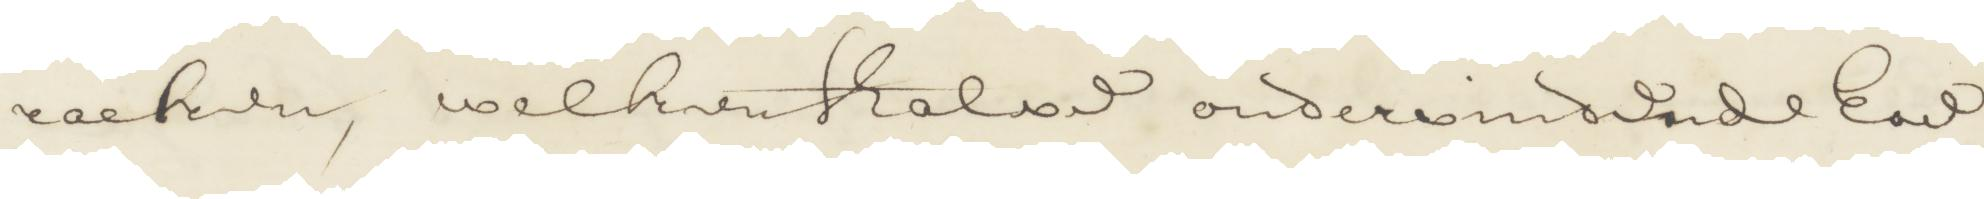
raeken, welken thalve ondervindende hoe
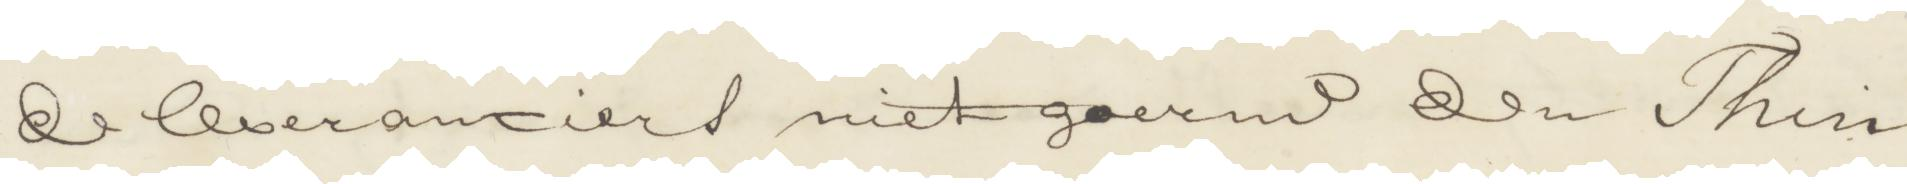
de leveranciers niet gaerne den Thin
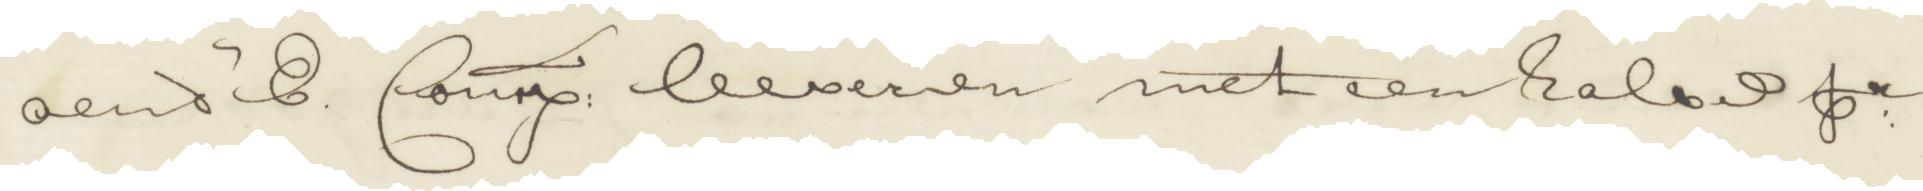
aen d' E. Comp: leeveren met een halve p:r
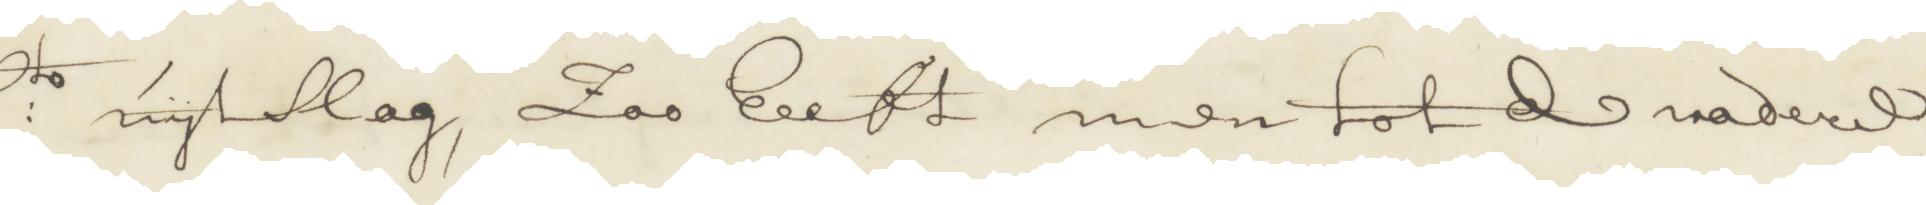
:to uijtslag, zoo heeft men tot de nadere
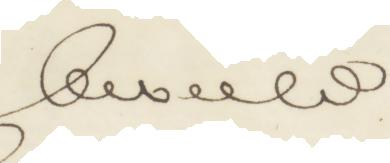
beveele
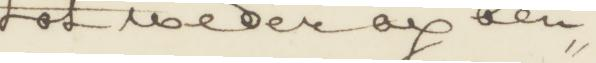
tot weder op beu„
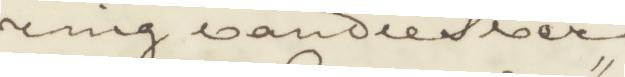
ring van dies ver„
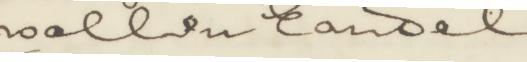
vallen handel
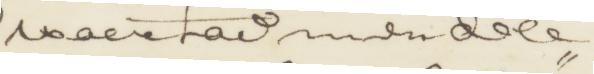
waertoe men de le„
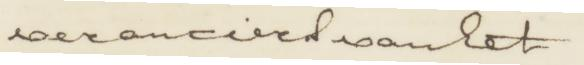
veranciers van het
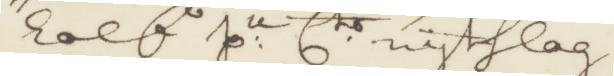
half p:r C:to uijtslag
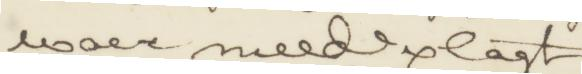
waer meede plagt
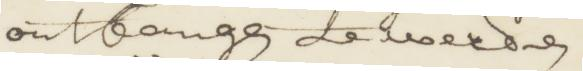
ontfangen te werden
